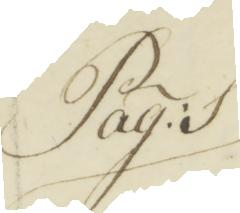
Pag:1
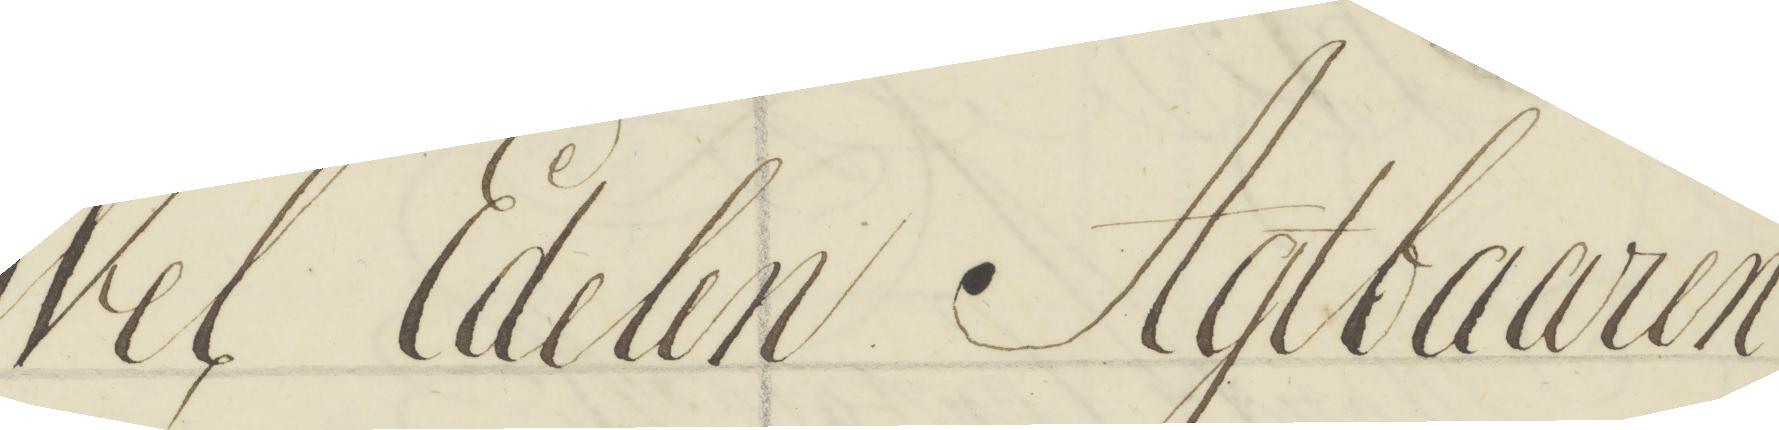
Wel Edelen Agtbaaren
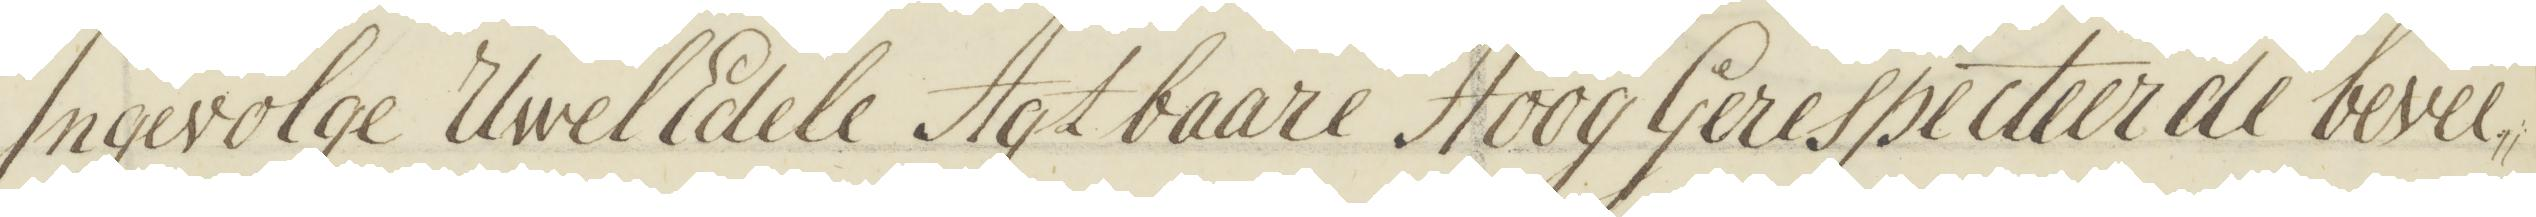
Jngevolge Uwel Edele Agtbaare Hoog Gerespecteerde bevel„
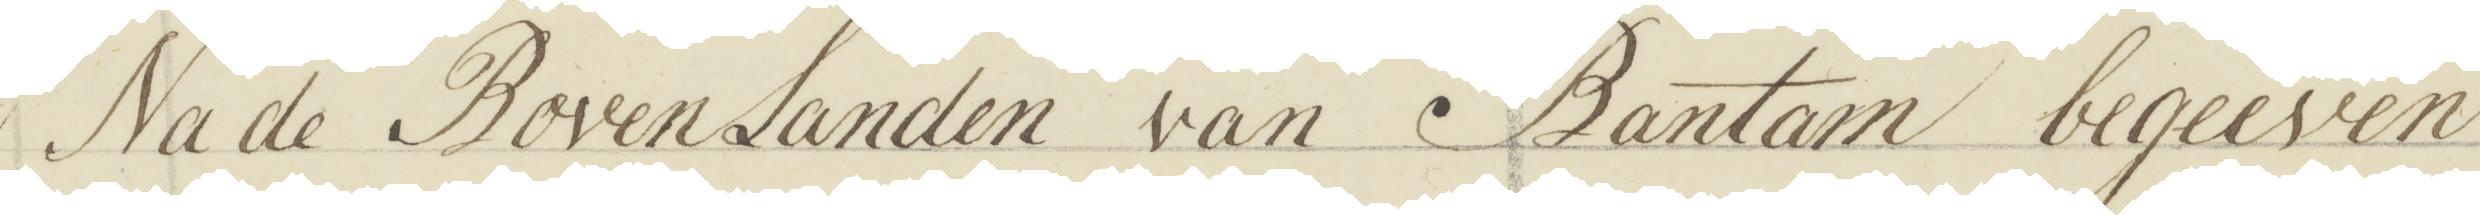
Na de Bovenlanden van Bantam begeeven
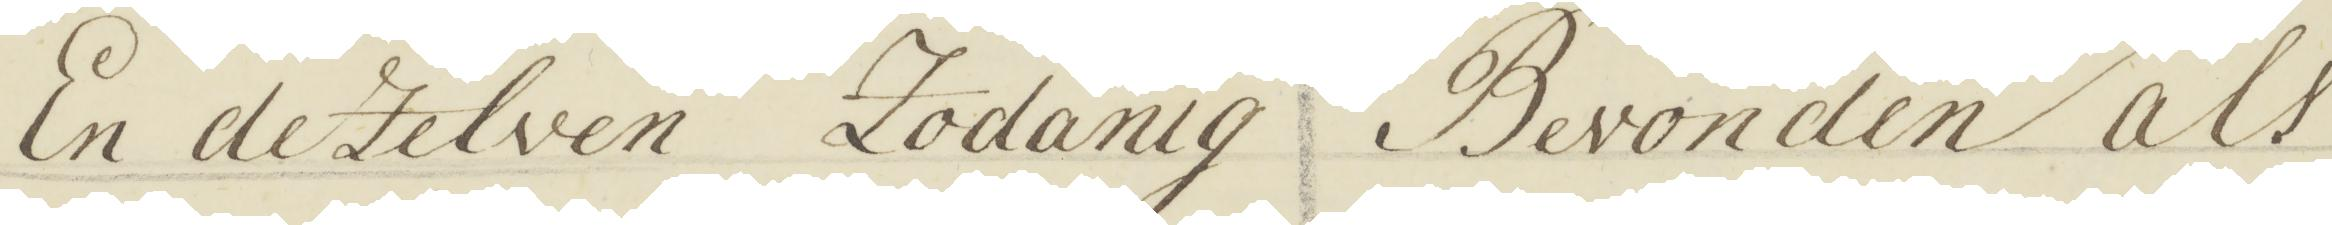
En dezelven Zodanig Bevonden als
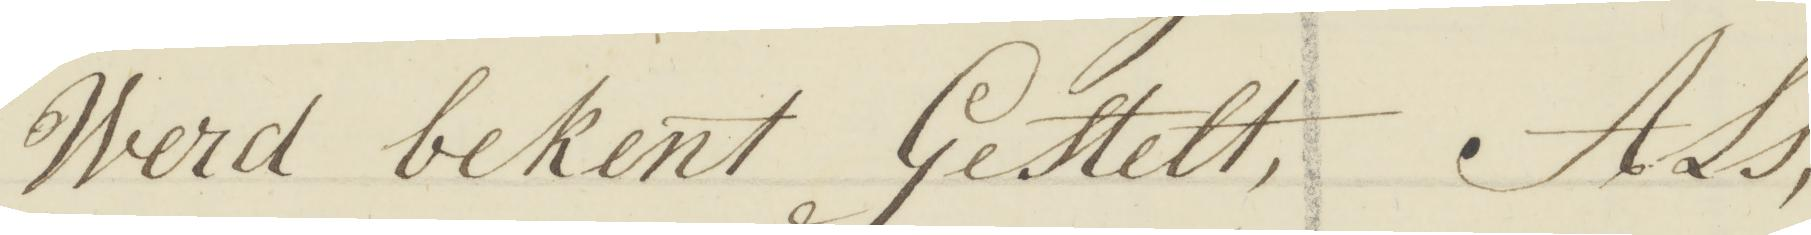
Werd bekent Gestelt, Als,
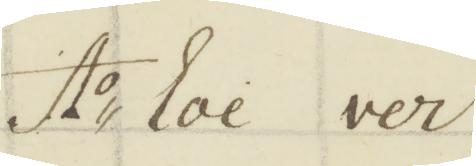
A„o hoe ver
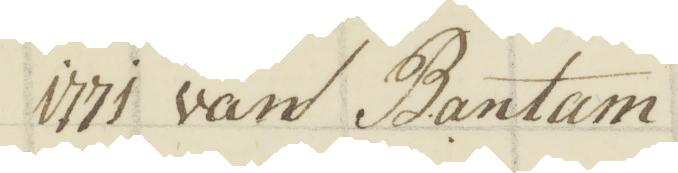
1771 van Bantam
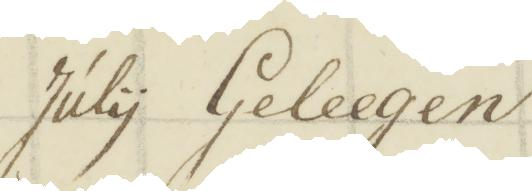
Julij Geleegen
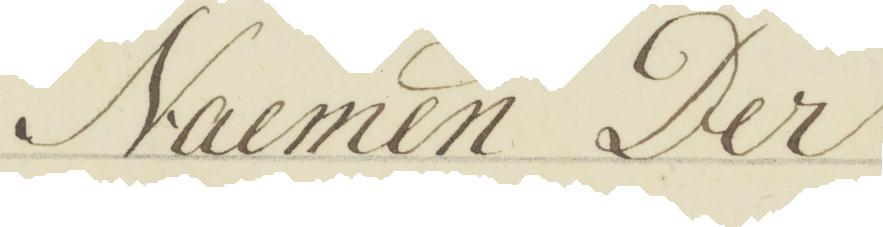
Naemen Der
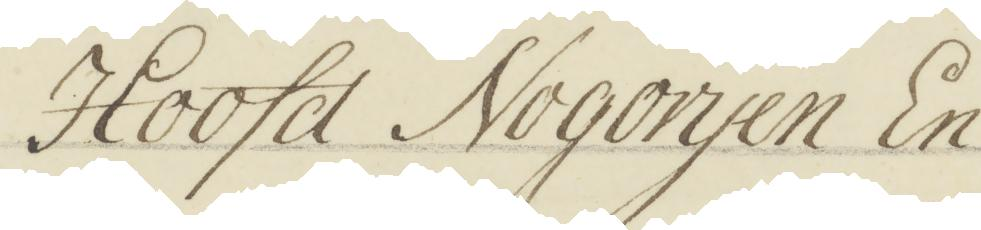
Hoofd Nogoryen En
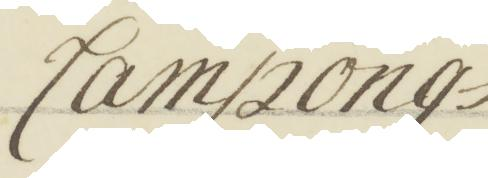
Campong
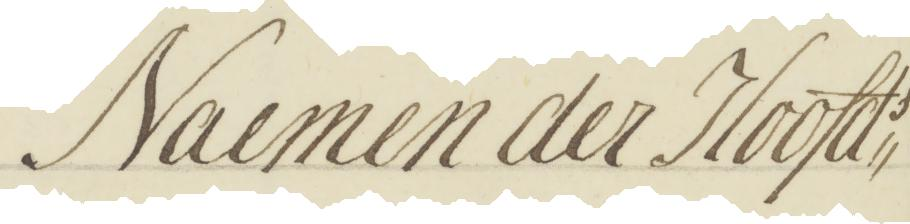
Naemen der Hoofd„s
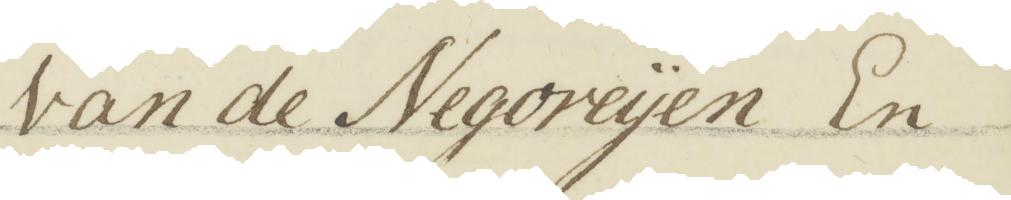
van de Negoreijen En
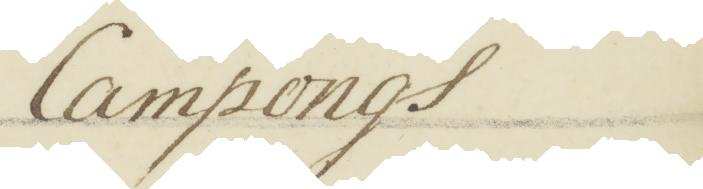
Campongs
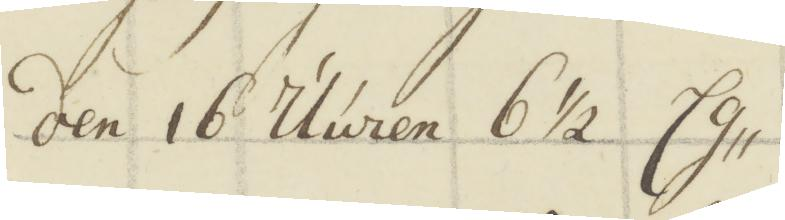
den 16 Uuren 6½ Cg„
